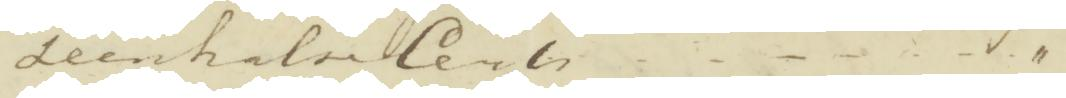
& een halve Cents- - - - - - „
